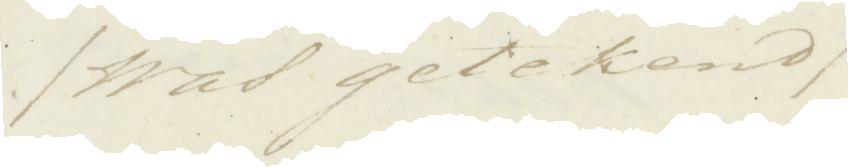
/was getekend/
